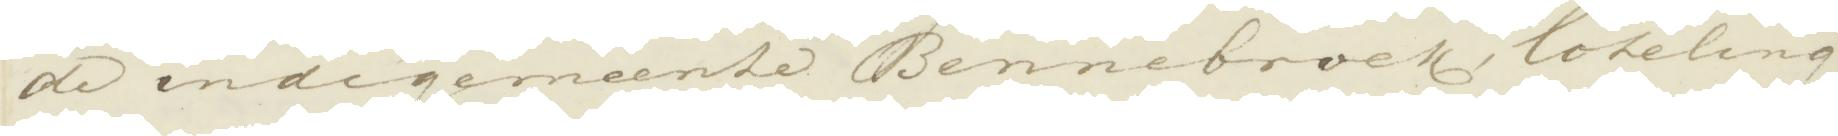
de in de gemeente Bennebroek, loteling
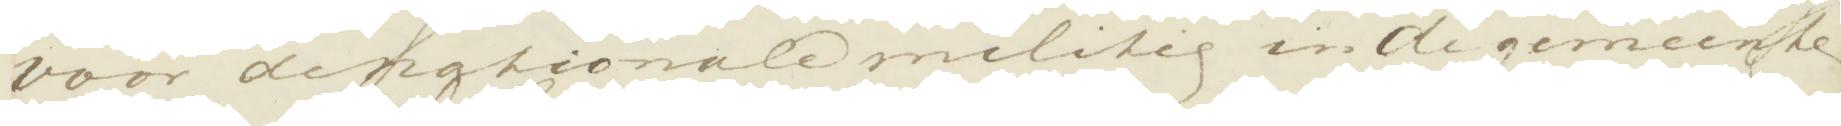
voor de nationale militie in de gemeente
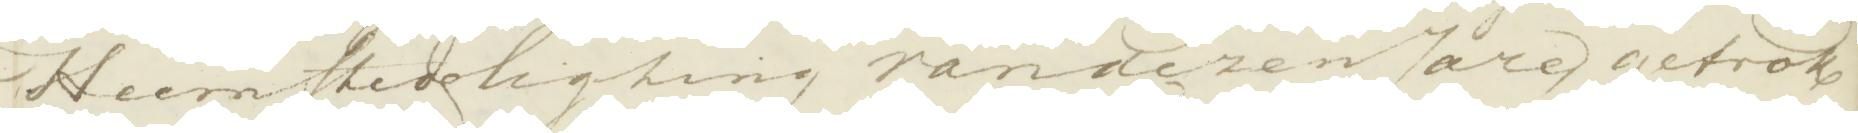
Heemstede ligting van dezen Jare getrok
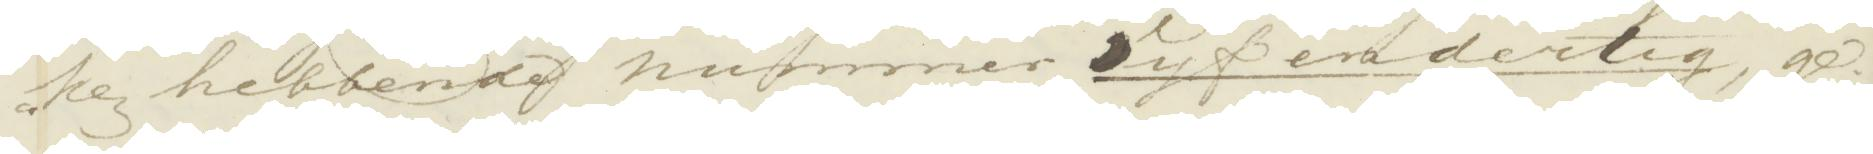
ken hebbende Nummer Vyf en dertig, ge„
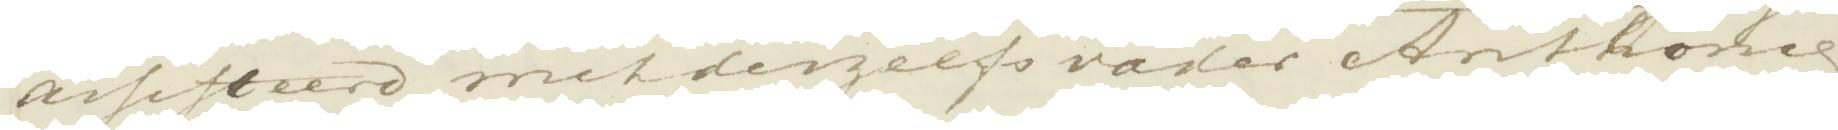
assisteerd met deszelfs vader Anthonie
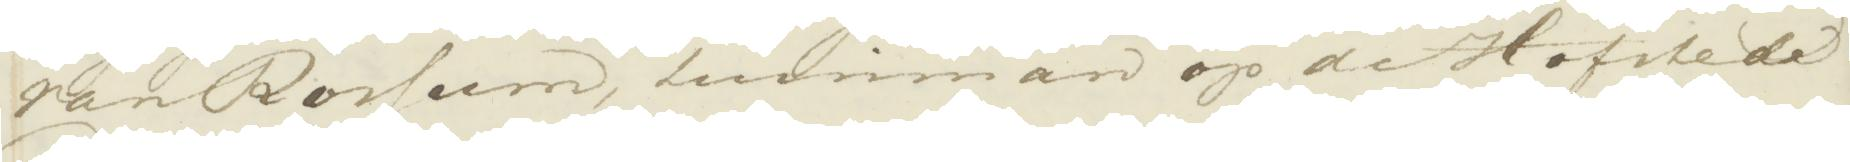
van Rossum, tuinman op de Hofstede
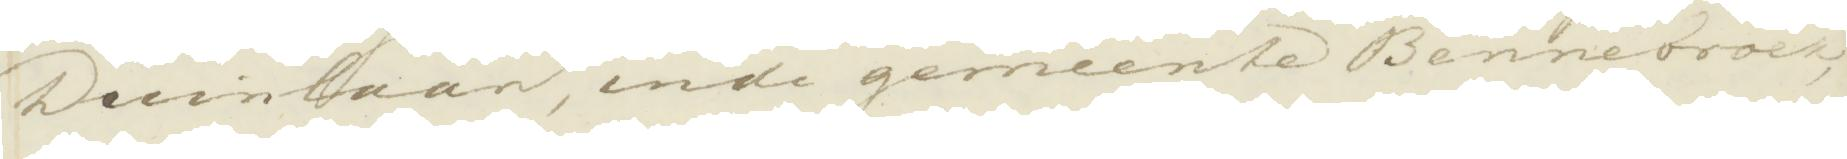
Duinlaan, inde gemeente Bennebroek,
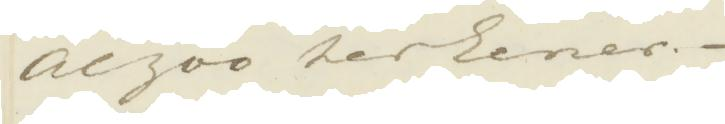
alzoo ter Eener. —
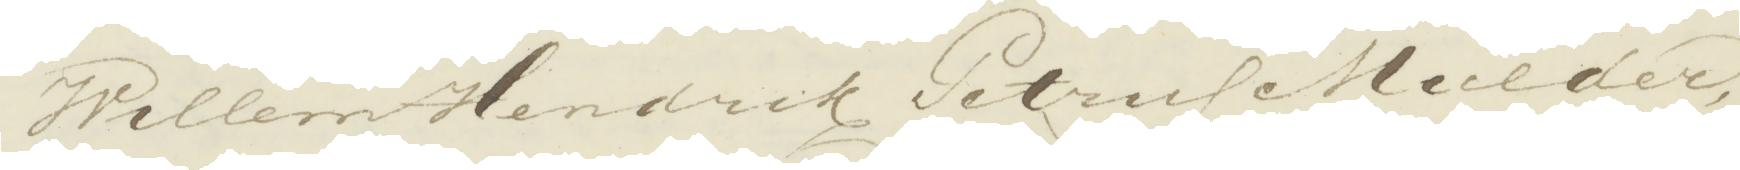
Willem Hendrik Petrus Mulder,
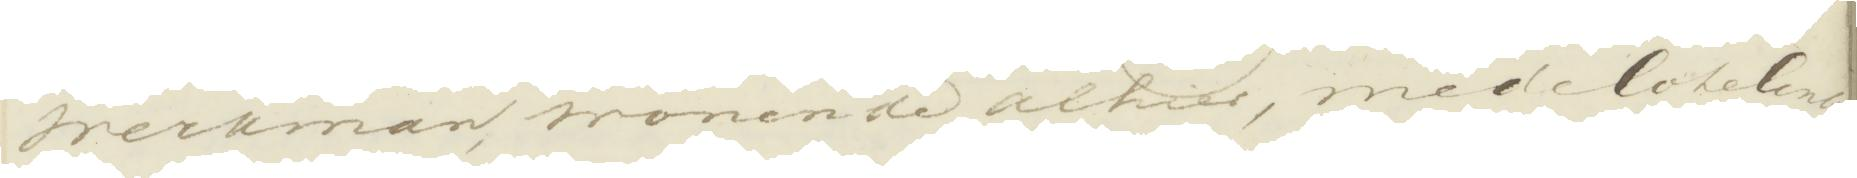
werkman, wonende alhier, medeloteling
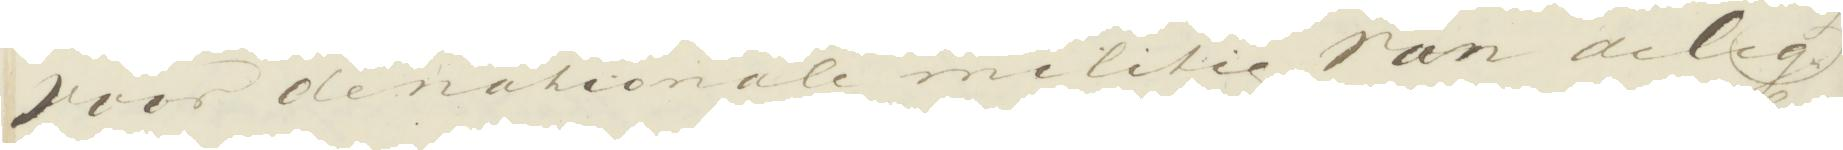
voor de nationale militie van de lig
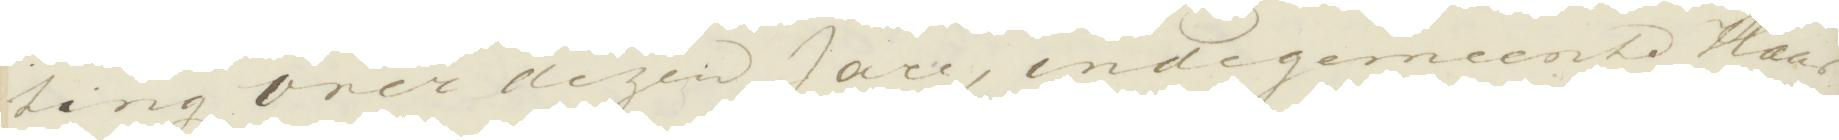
ting over dezen Jare, in de gemeente Haar
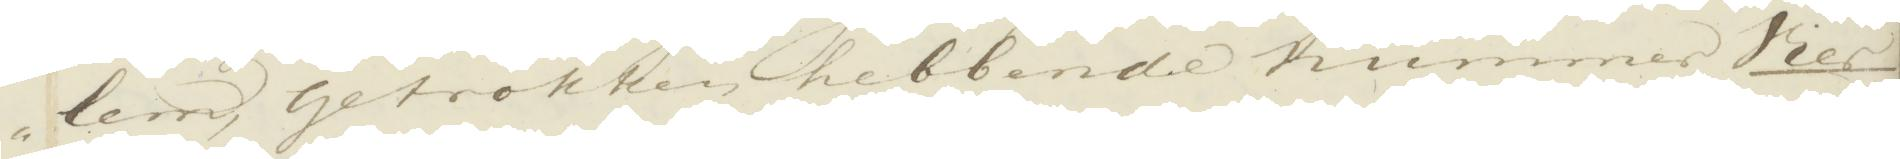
„lem, Getrokken hebbende Nummer Vier
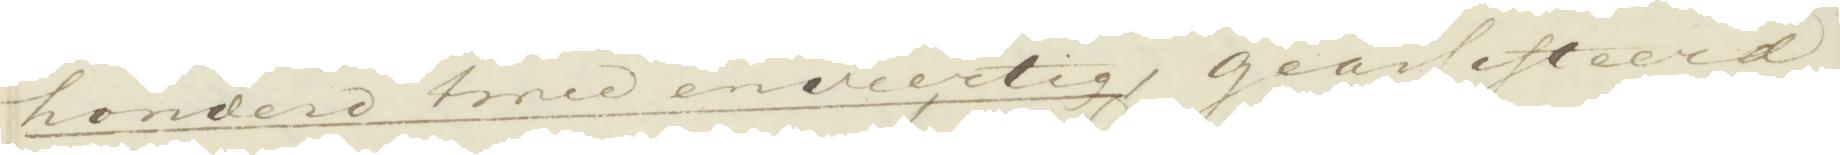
honderd twee en veertig, geassisteerd
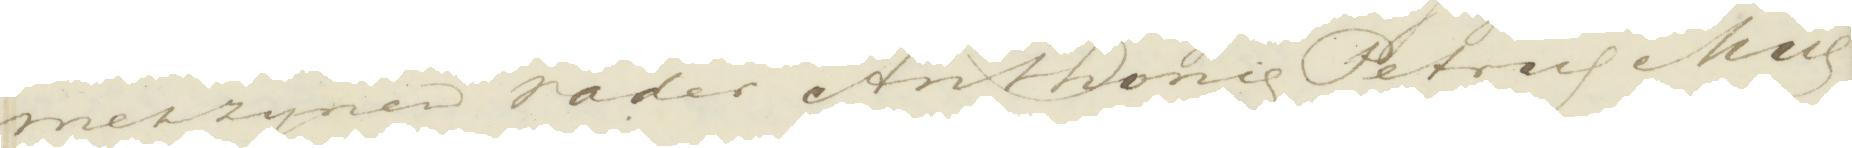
met zynen vader Anthonie Petrus Mul
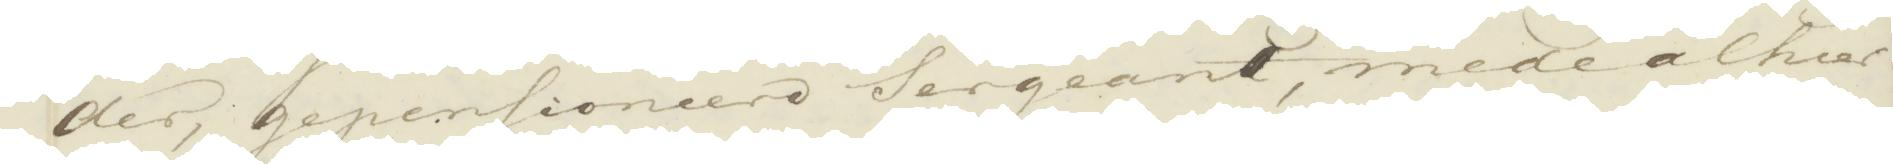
der, gepensioneerd sergeant, mede alhier
